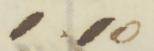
1.10
